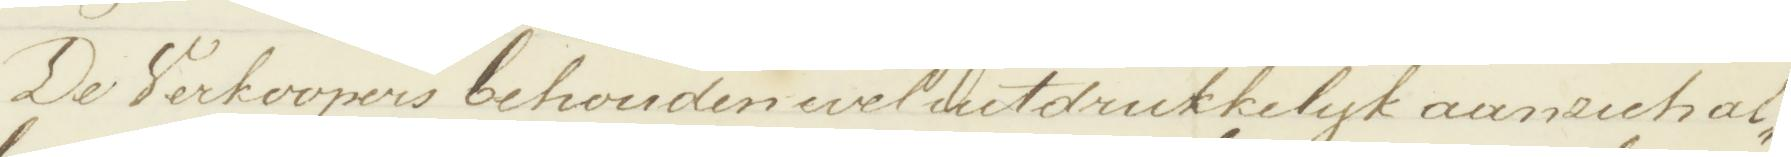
De Verkoopers behouden wel uitdrukkelyk aan zich al„
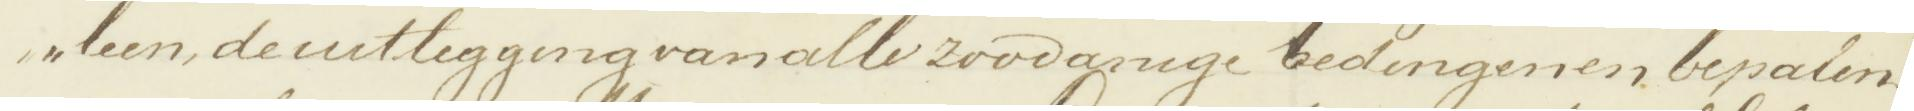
,„leen, de uitlegging van alle zoodanige bedingen en bepalin,
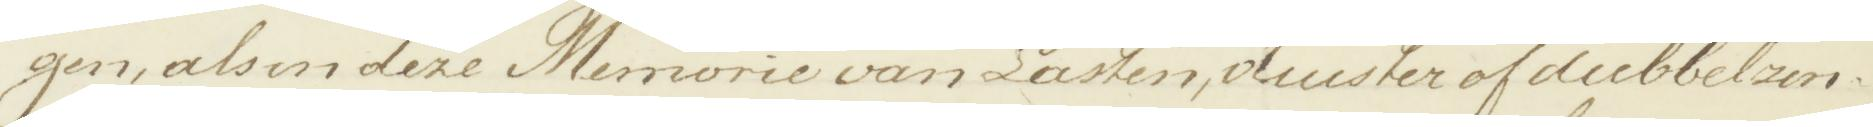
gen, als in deze Memorie van Lasten, duister of dubbelzin,
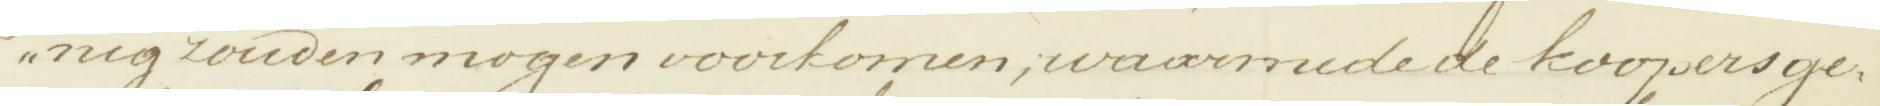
„nig zouden mogen voorkomen, waarmede de koopers ge,
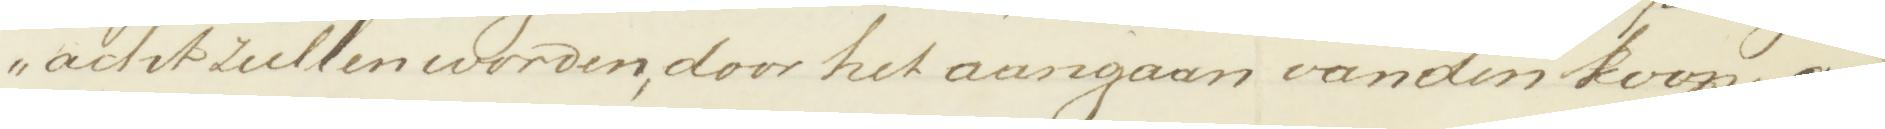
„acht zullen worden, door het aangaan van den koop, ge
